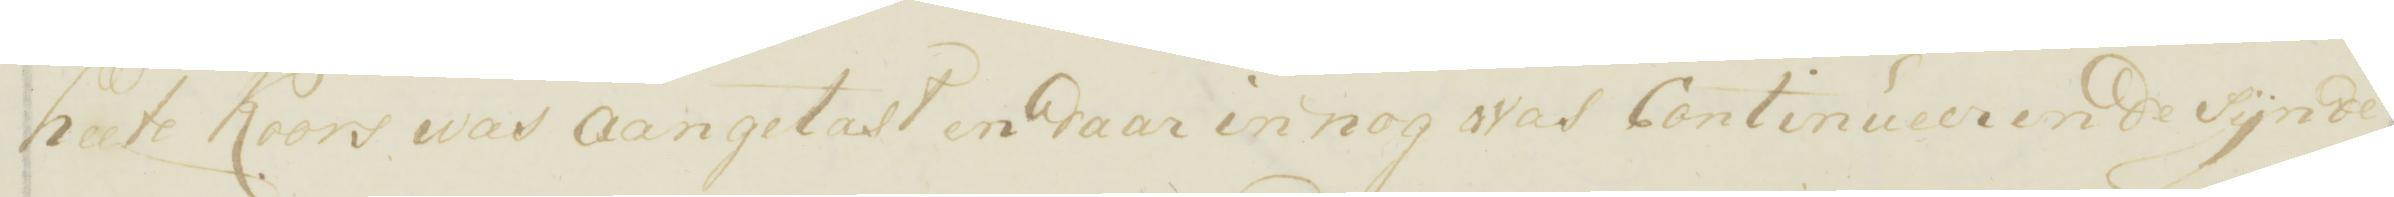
heete koors was aangetast en daar in nog was Continueerende sijnde
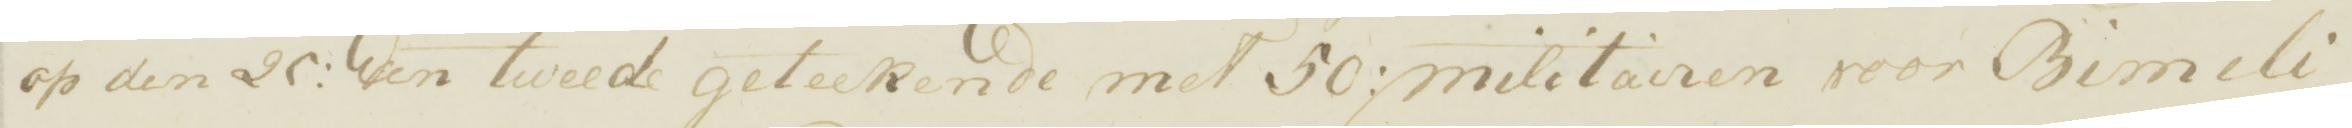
op den 25: den tweede geteekende met 50: militairen voor Bimeli
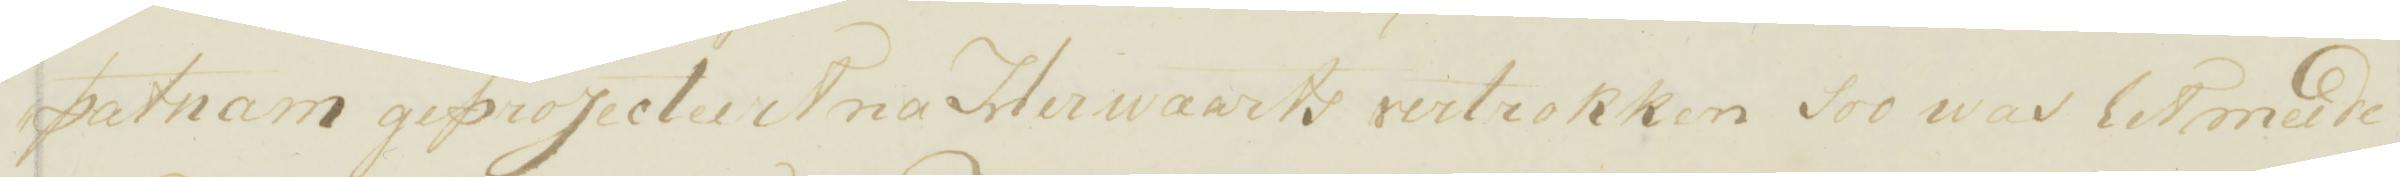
„patnam geprojecteert na Herwaarts vertrokken, soo was het meede
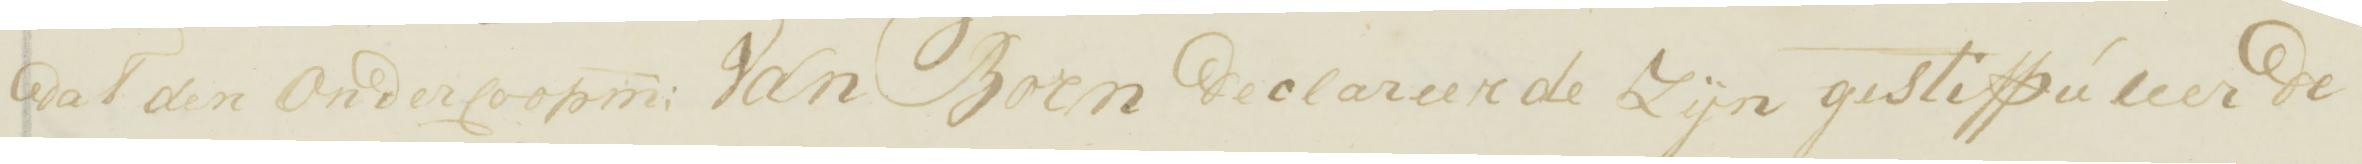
dat den Ondercoopm: Van Boen declareerde zijn gestippuleerde
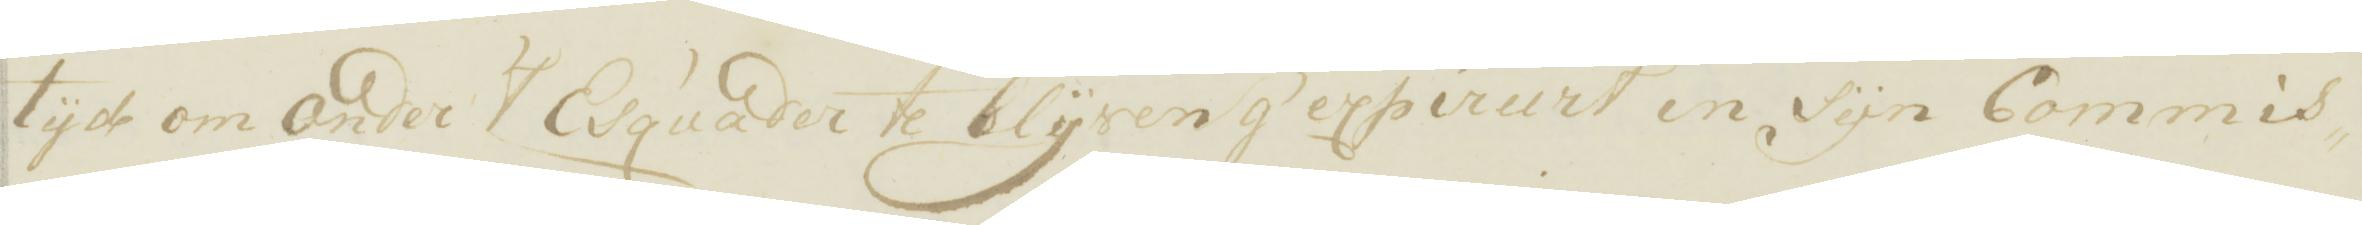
tijd om onder 't Esquader te blijven g’expireert en sijn Commis„
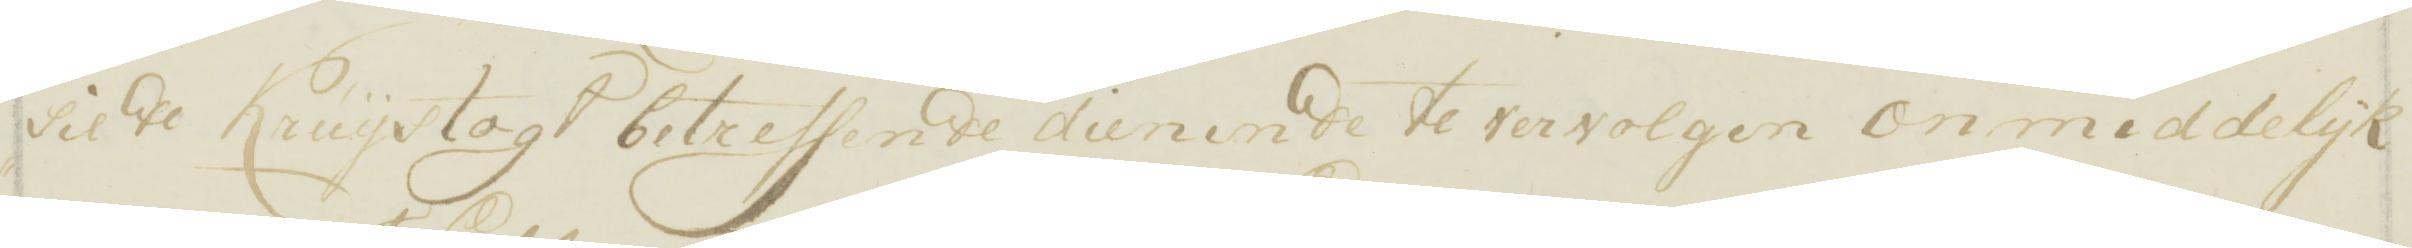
„sie de Kruijstogt betreffende dienende te vervolgen onmiddelijk
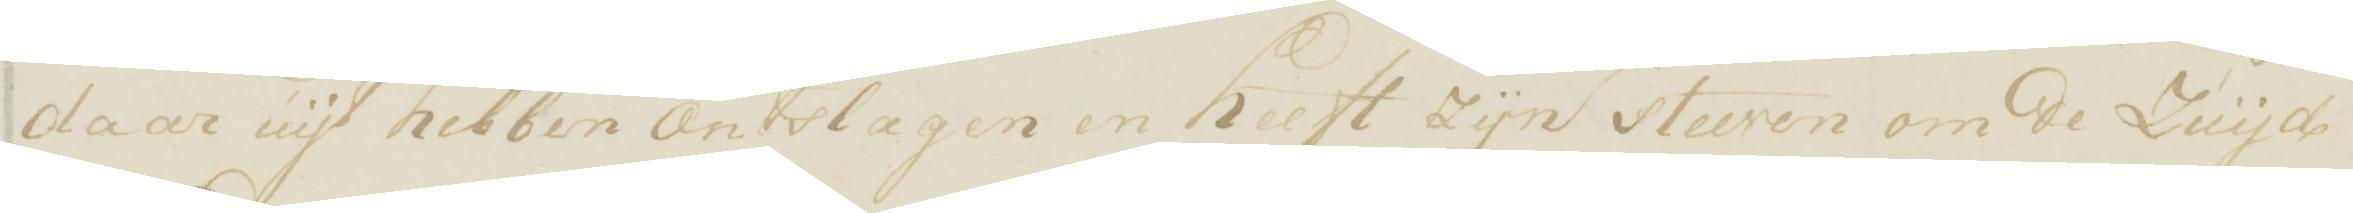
daar uijt hebben ontslagen en heeft zijn steeven om de Zuijd
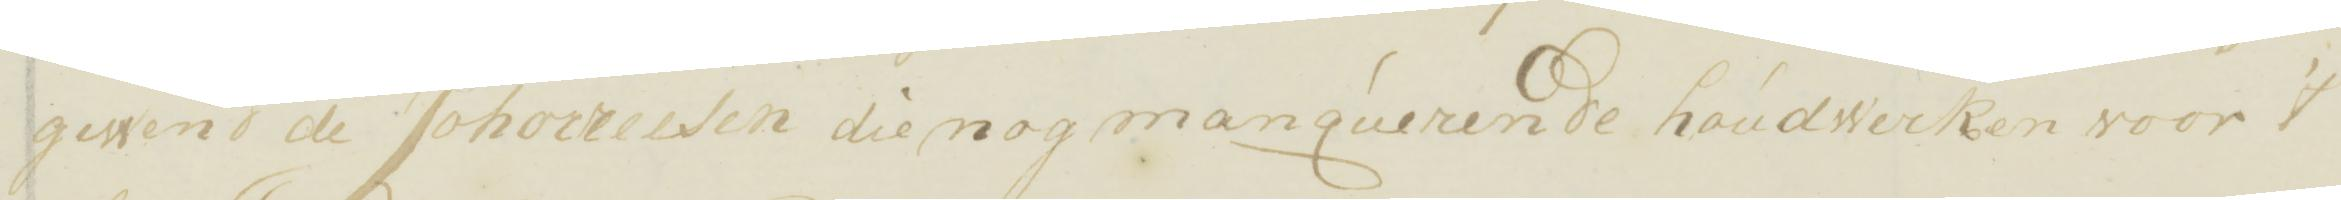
gewend de Johorreesen die nog manquerende houdwerken voor ’t
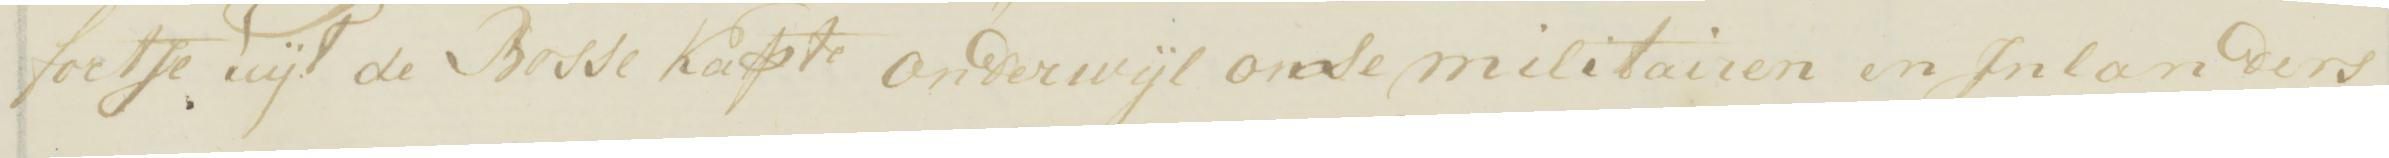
foetje uijt de Bosse kapte onderwijl onse militairen en Jnlanders
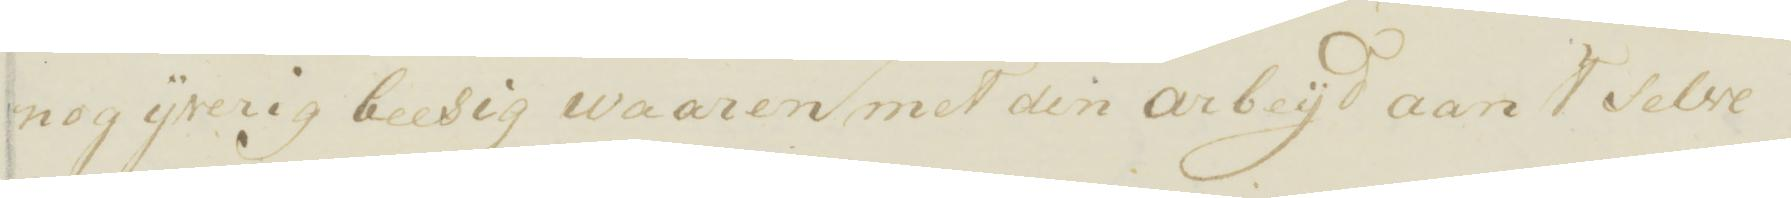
nog ijverig beesig waaren met den arbeijd aan ’t selve
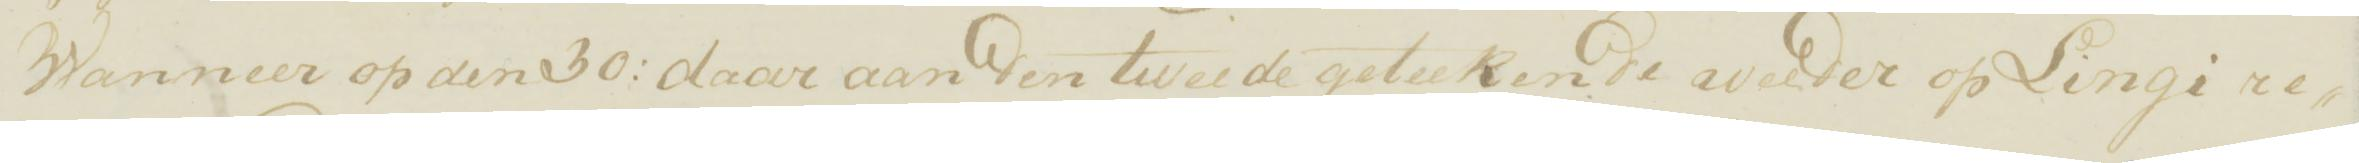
Wanneer op den 30: daar aan den tweede geteekende weeder op Lingi re„
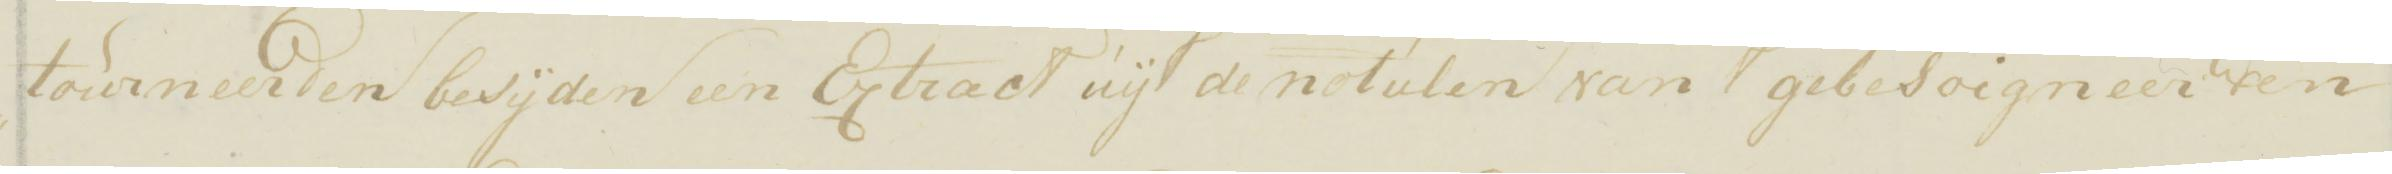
tourneerden besijden een Extract uijt de notulen van ’t gebesoigneerden
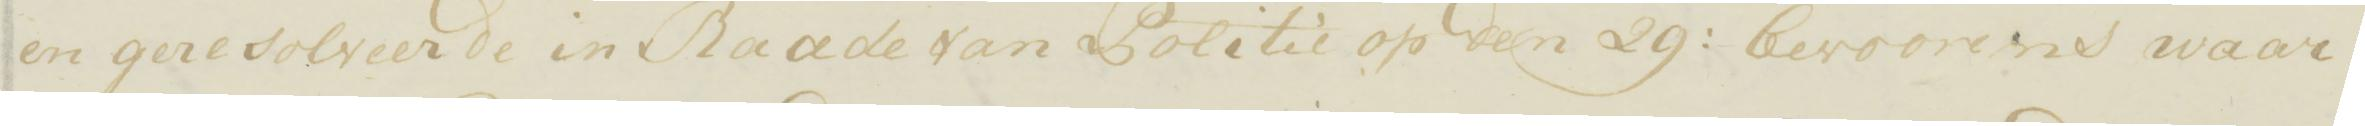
en geresolveerde in Raade van Politie op den 29:e bevoorens waar
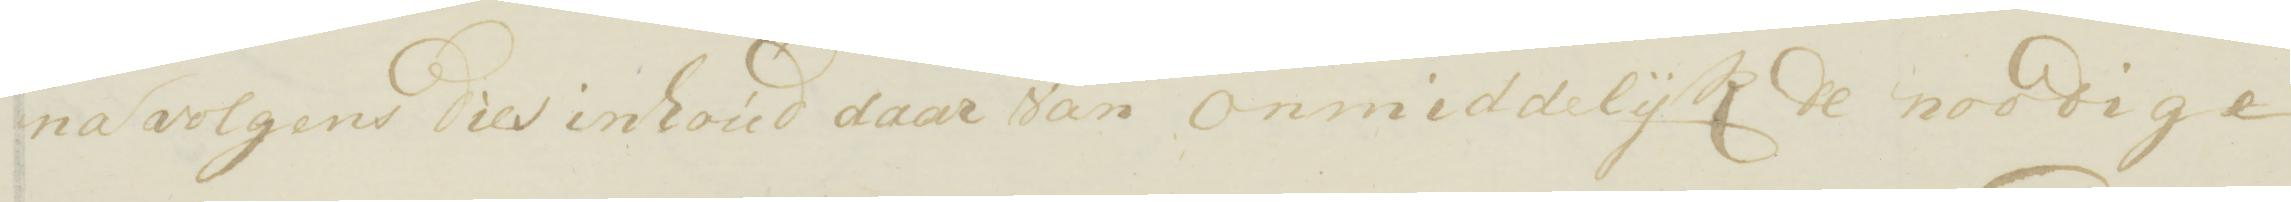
na volgens dies inhoud daar van onmiddelijk de noodige
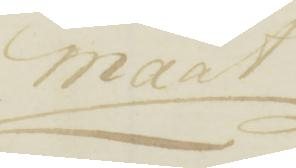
maat
